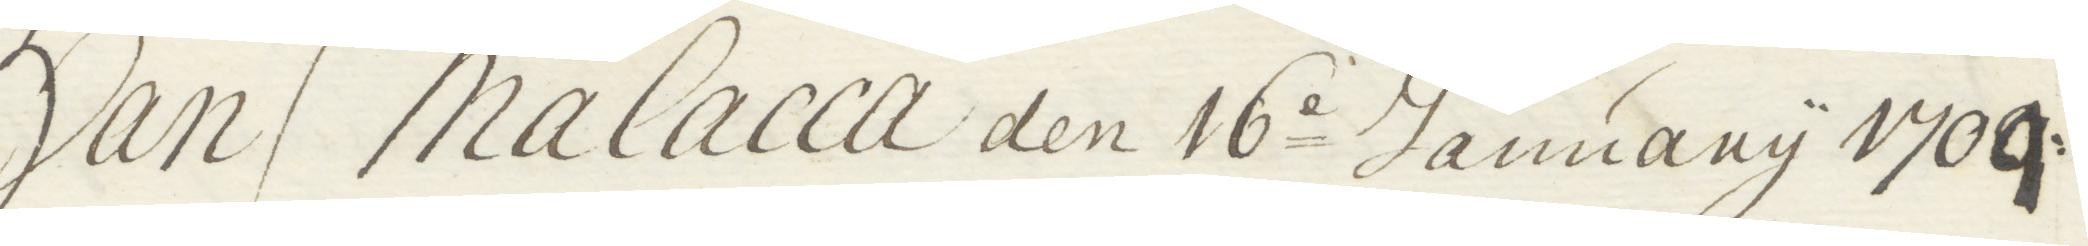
Van Malacca den 16=e Januarij 1704:
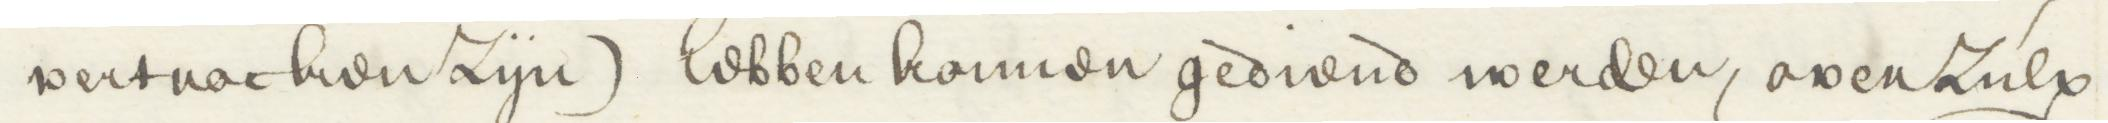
vertrocken zijn) hebben konnen gediend werden, over zulx
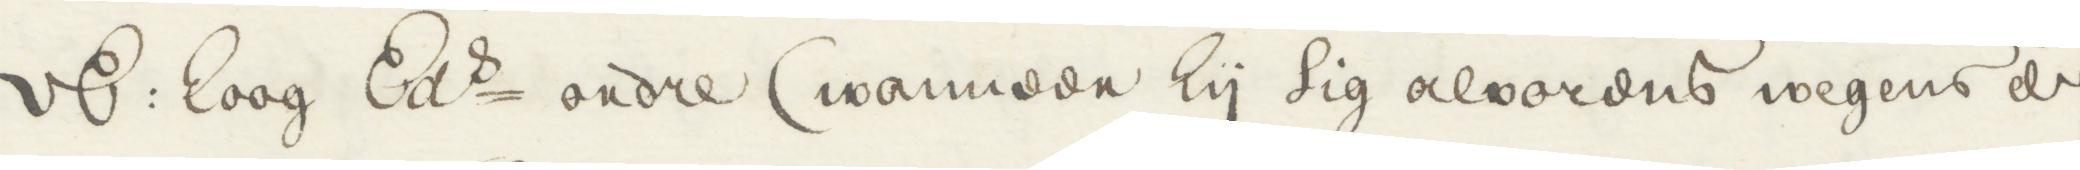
VE: Hoog Ed=e ordre (wanneer hij sig alvorens wegens de
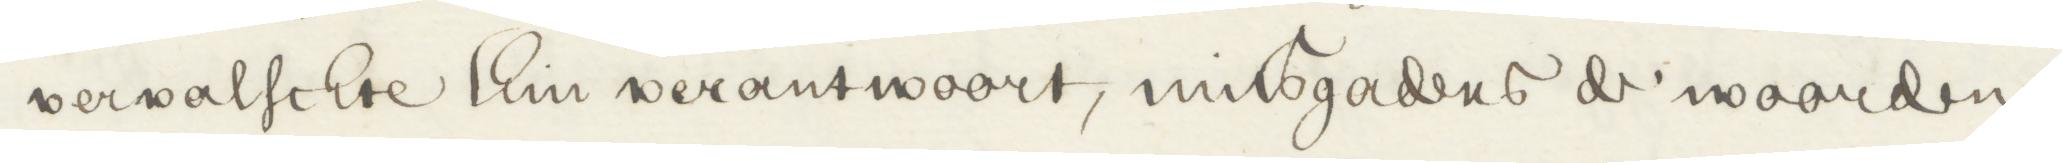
vervalschte thin verantwoort, mitsgaders de woorden
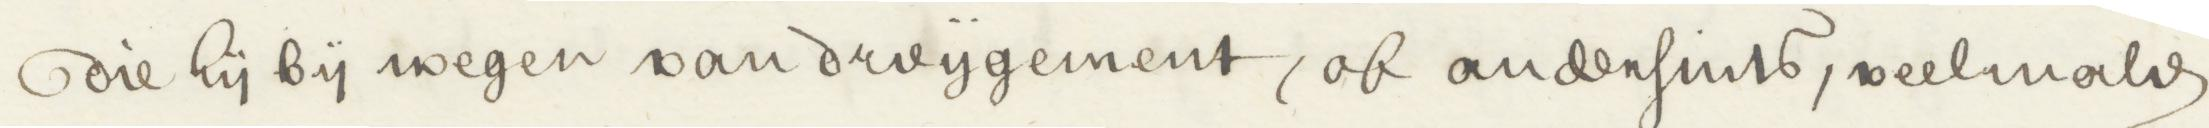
die hij bij wegen van dreijgement, of andersints, veelmalen
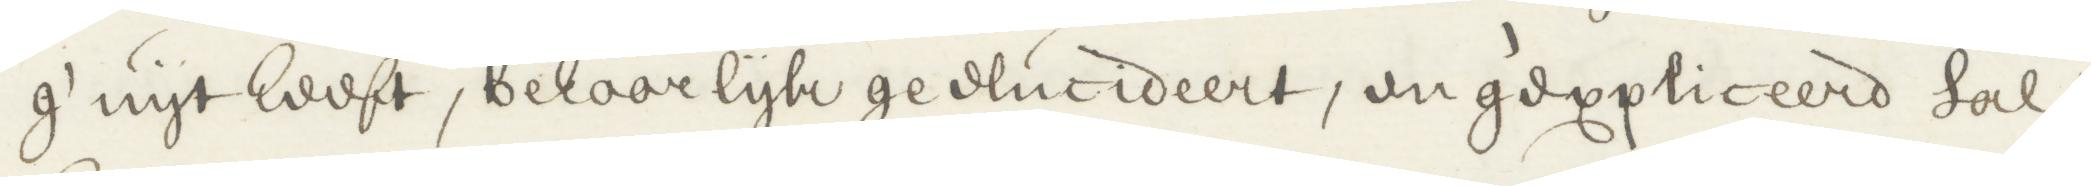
g’uijt heeft, behoorlijk geelucideert, en g'expliceerd sal
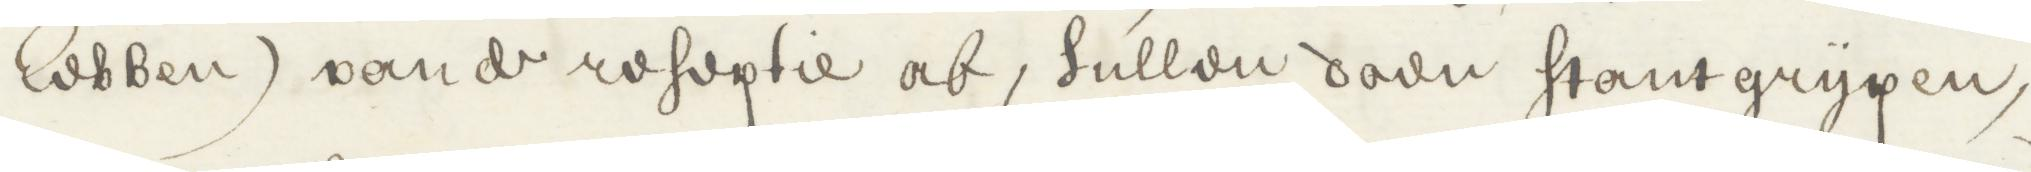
hebben) van de reseptie af, sullen doen stant grijpen,
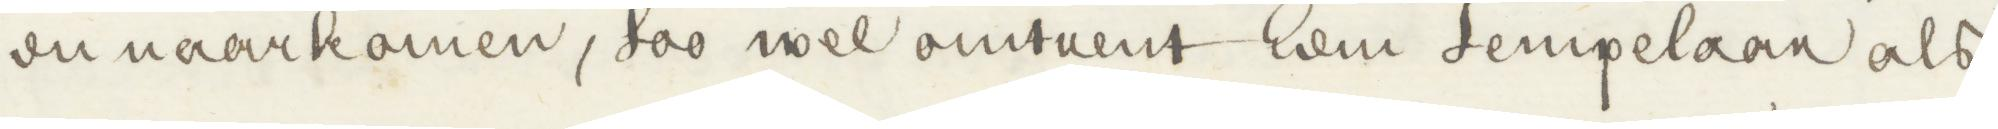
en naarkomen, soo wel omtrent hem tempelaar als
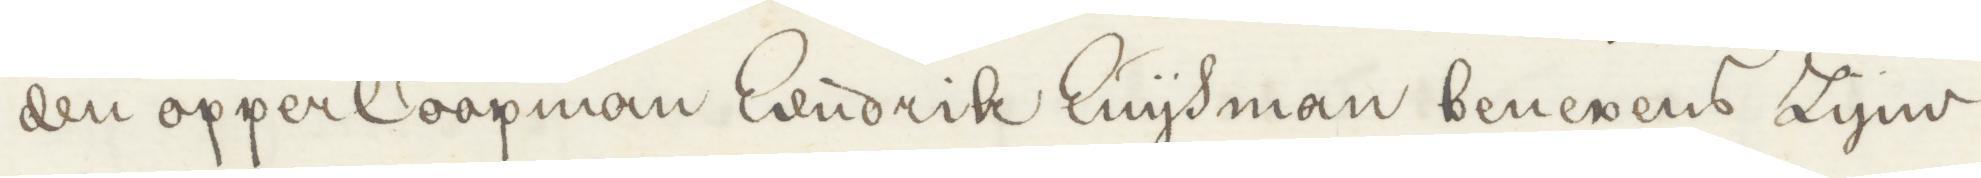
den oppercoopman Hendrik Huijsman benevens zijne
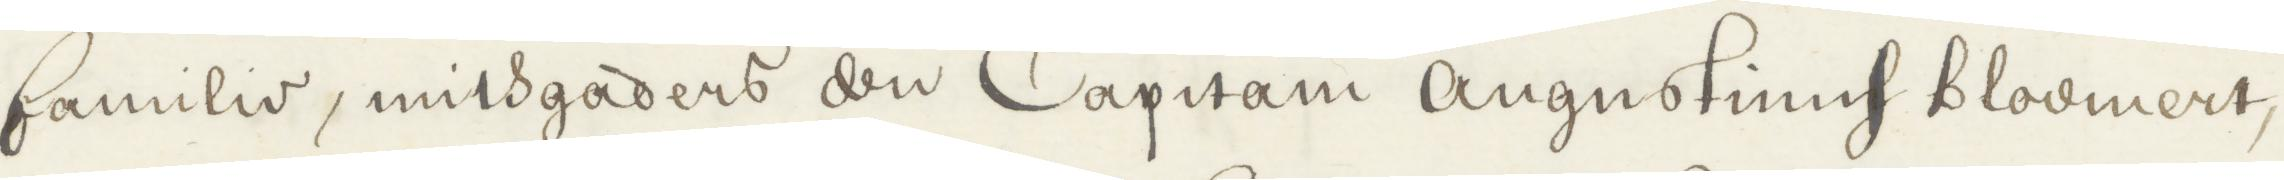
familie, mitsgaders den Capitain Augustinus bloemert,
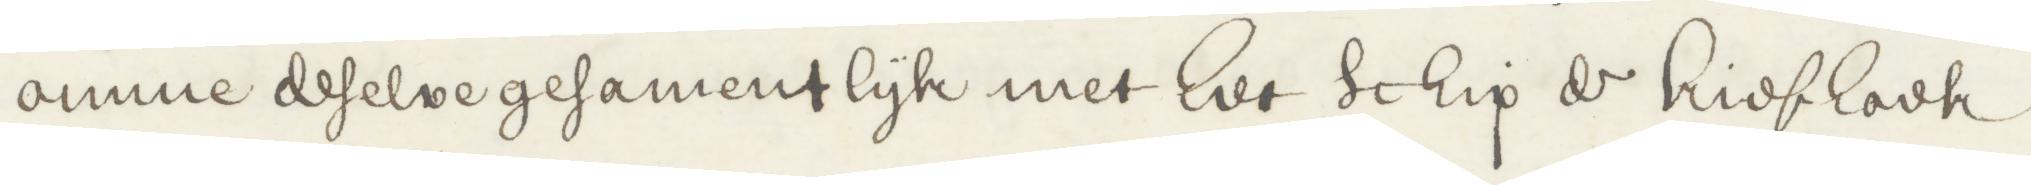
omme deselve gesamentlijk met het schip de kiefhoek
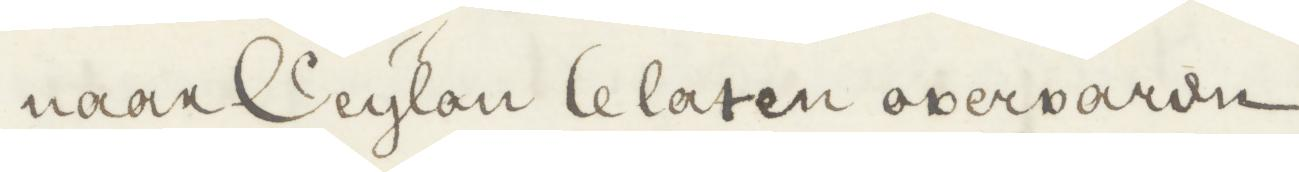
naar Ceylon te laten overvaren
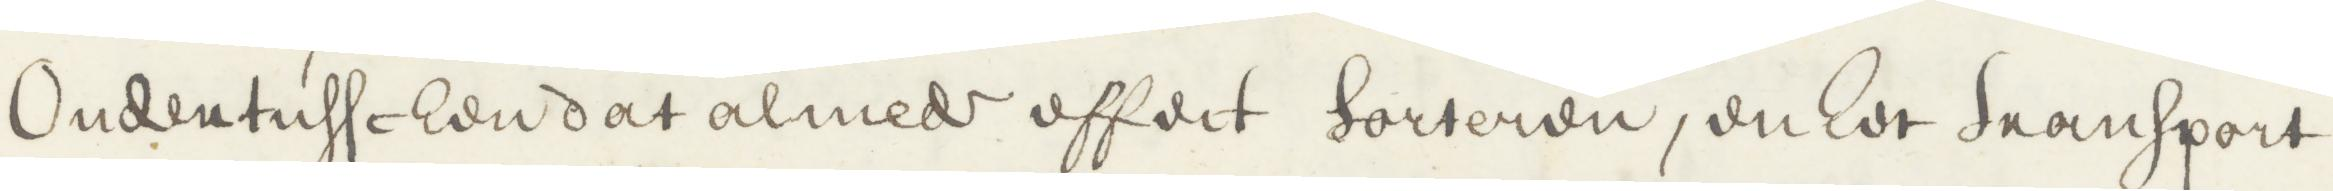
Ondertusschen dat almede effect sorteren, en het transport
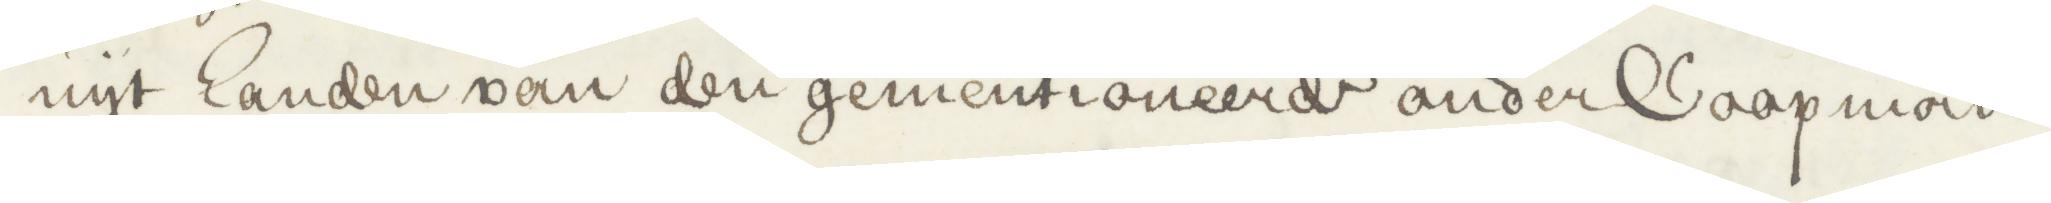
uijt handen van den gementioneerde onder Coopman
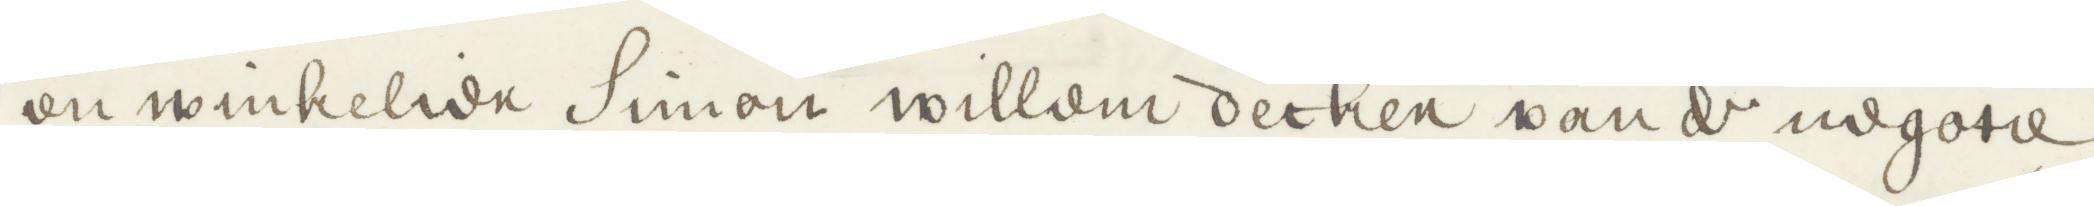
en winkelier Simon willem decker van de negotie
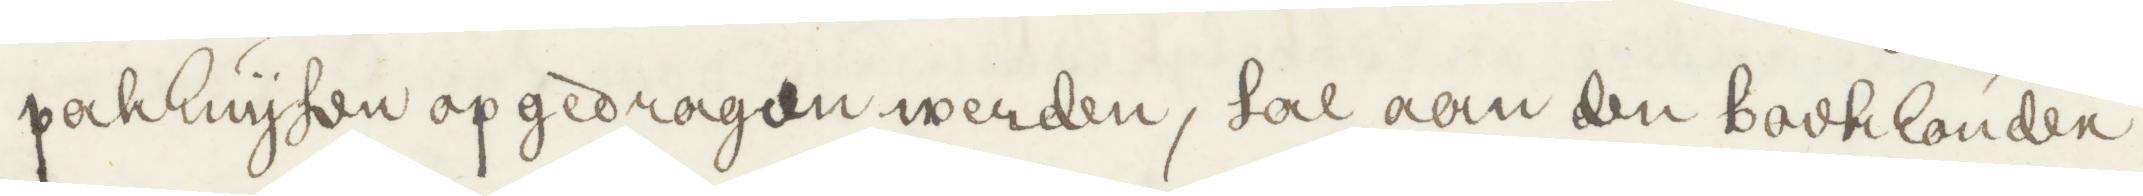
pakhuijsen opgedragen werden, sal aan den boekhouder
